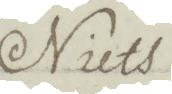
Niets
